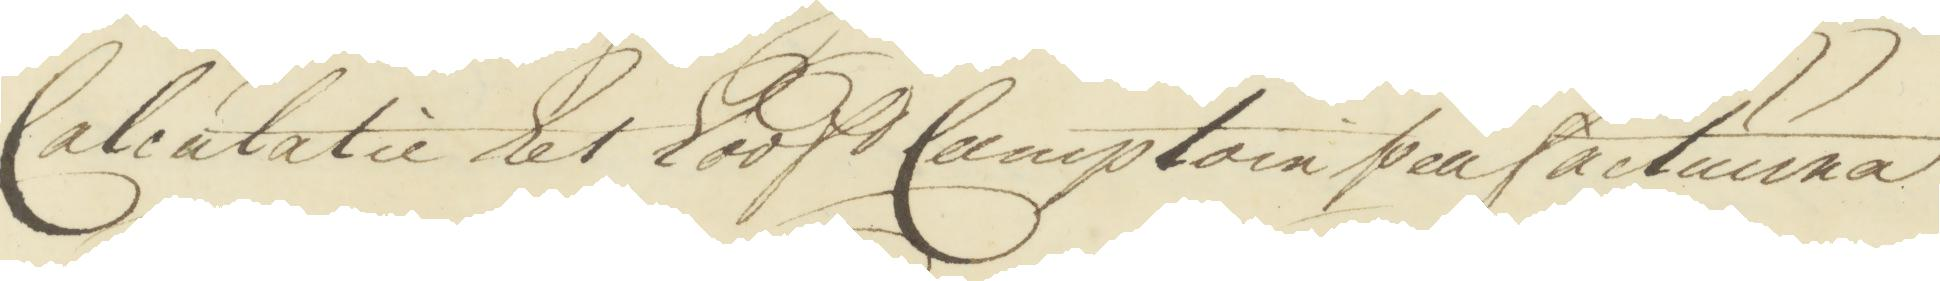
Calculatie het hoofd Comptoir per factuura
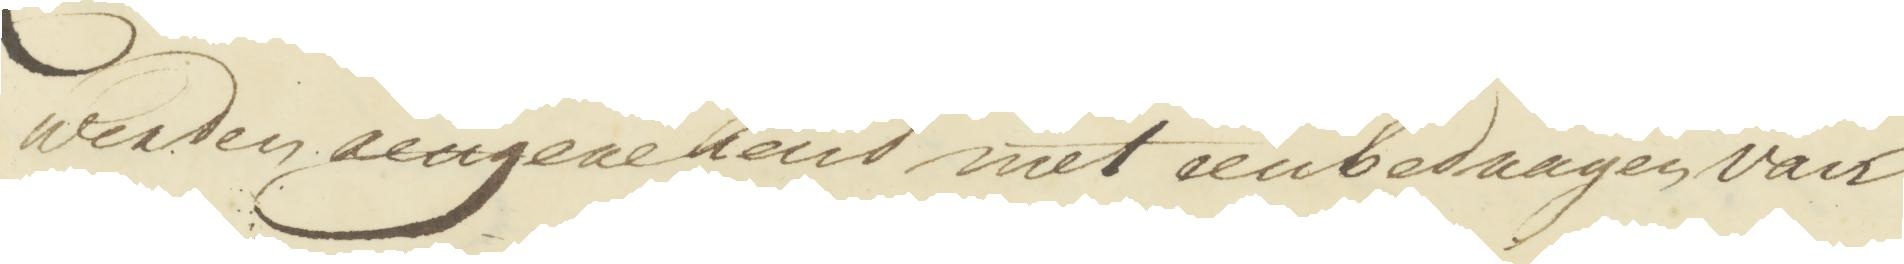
werden aengerekend met aenbedragen van
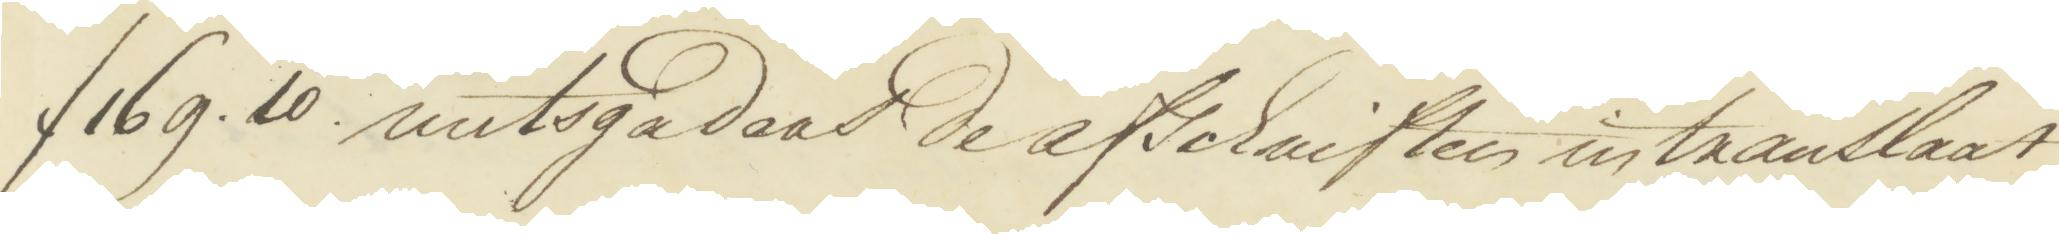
ƒ169.10. mitsgaders de afschriften in translaat
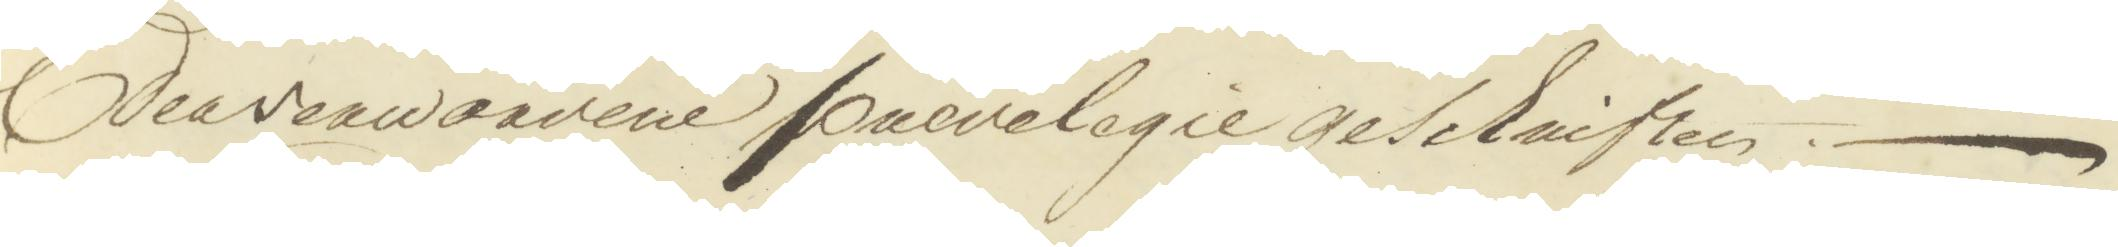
der verworvene prevelegie geschriften. —
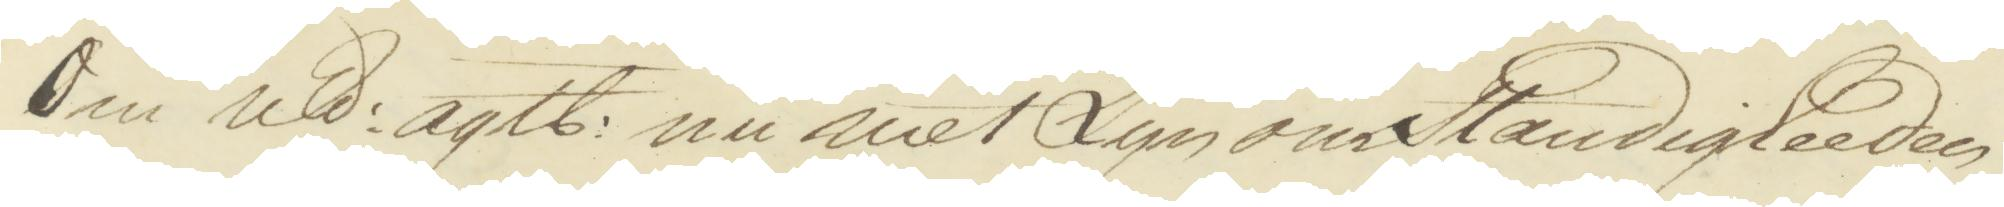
Om uEd: agtb: nu met zyn omstandigheeden
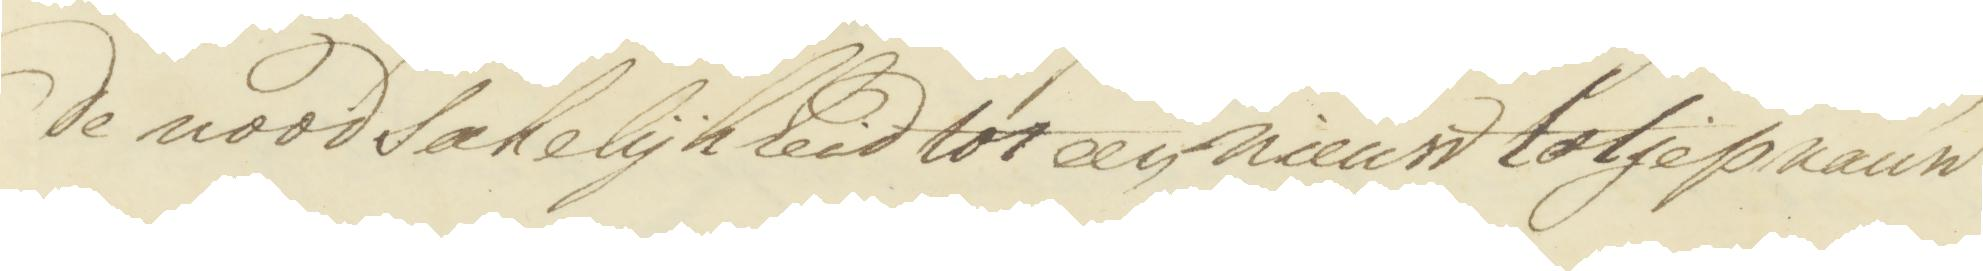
de noodsakelijkheid tot een nieuw totjeprauw
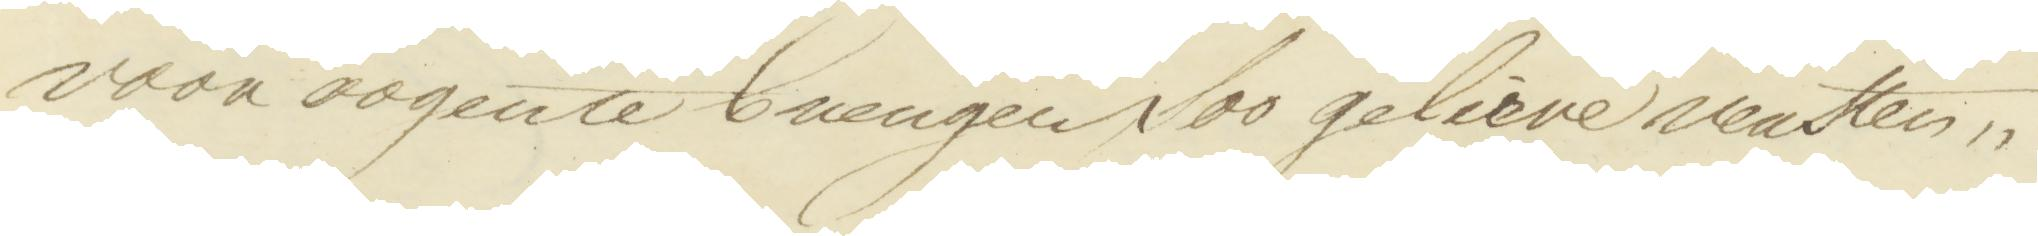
voor oogente brengen soo gelieve versten„
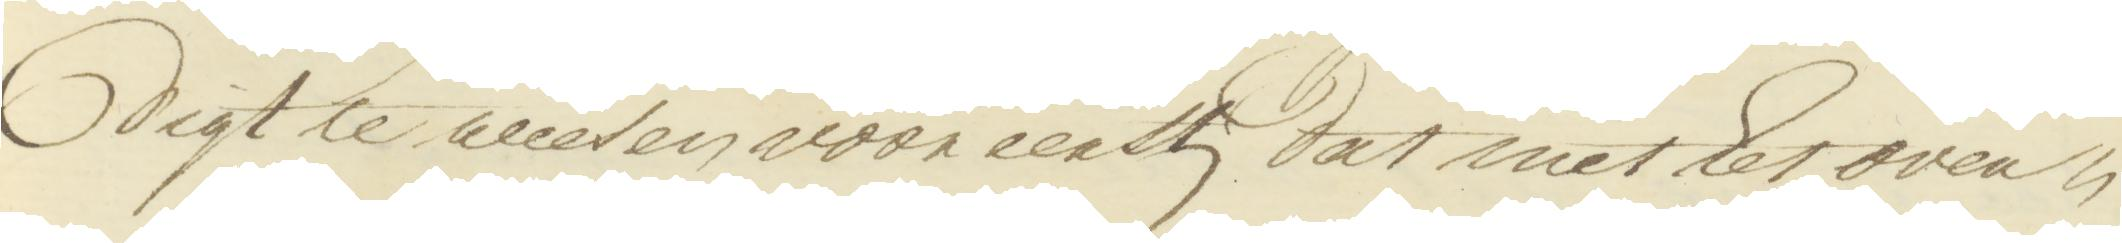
digt te weesen voor eerst dat met het over„
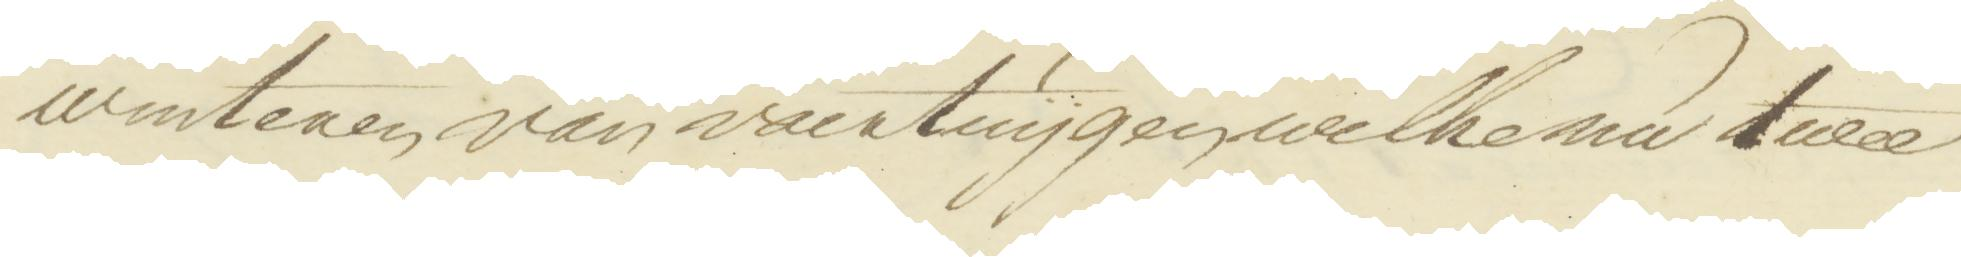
winteren van vaertuijgen welke nu twee
